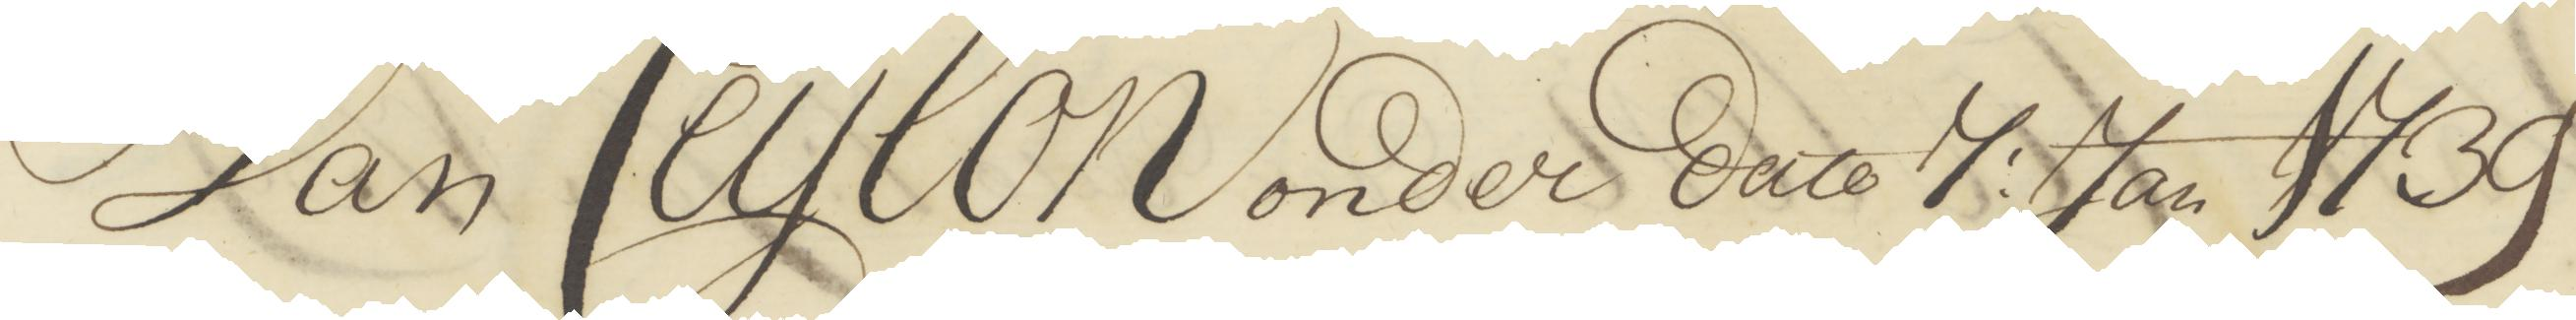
Van Ceijlon onder dato 7: Jan 1739
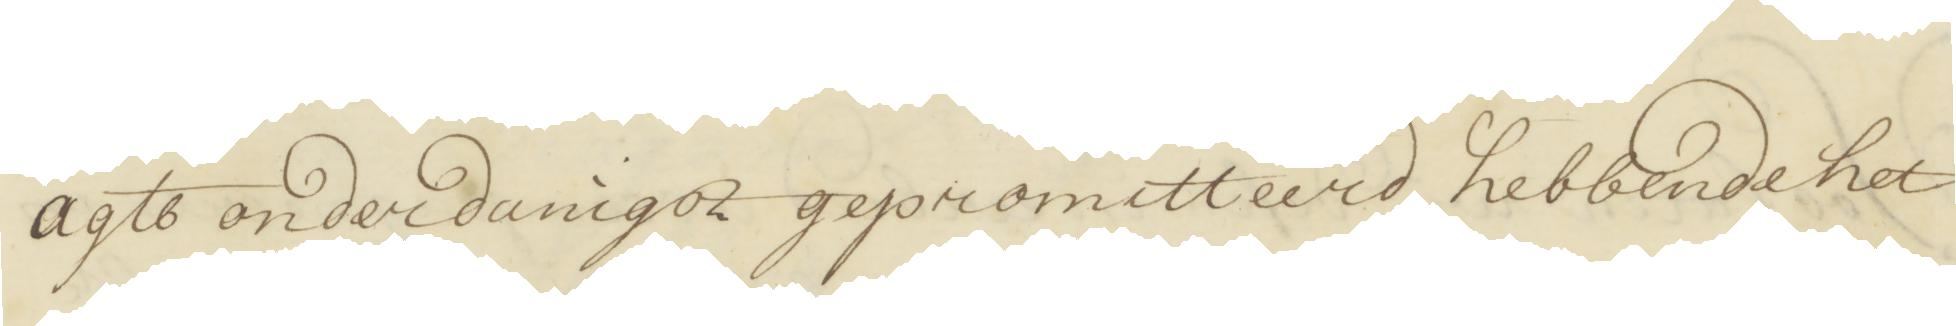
agtb onder danigst gepromitteerd hebbende het
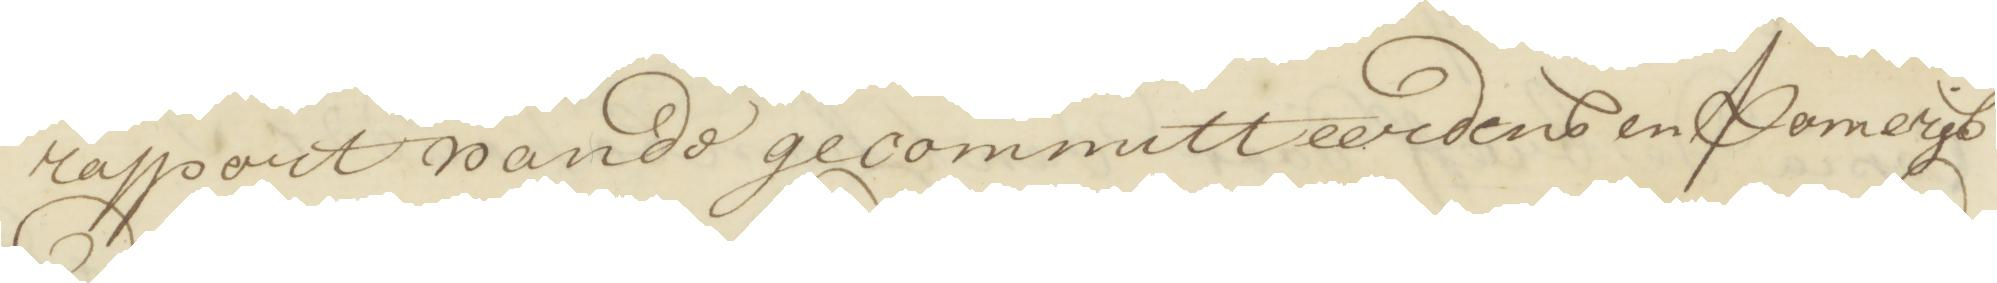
rapport vande gecommitteerdens en Pomerjt
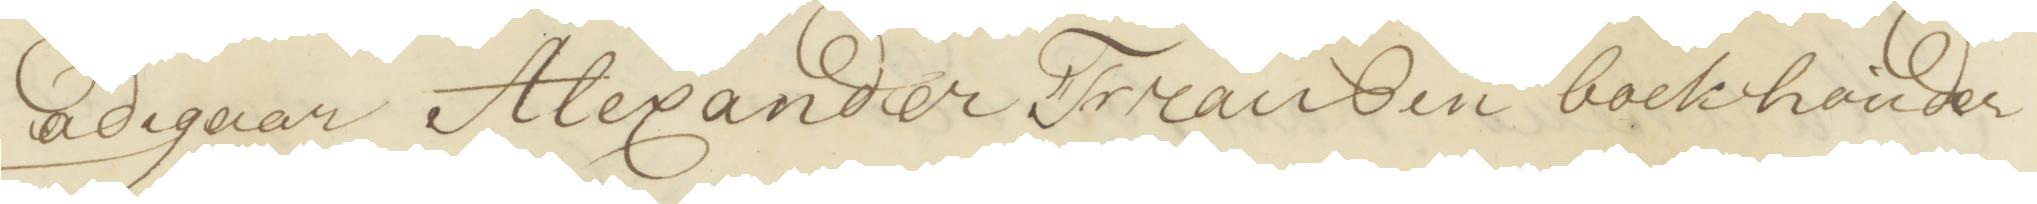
adigaar Alexander Fransen boekhouder
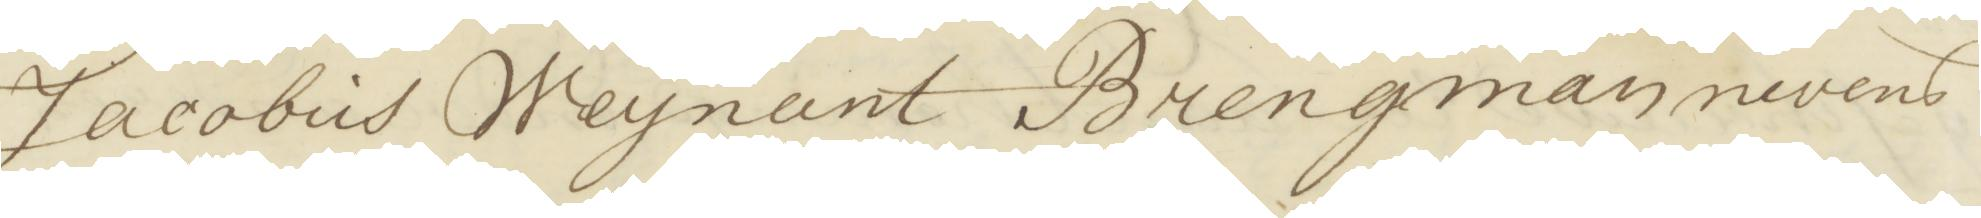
Jacobus Weynant Brengman nevens
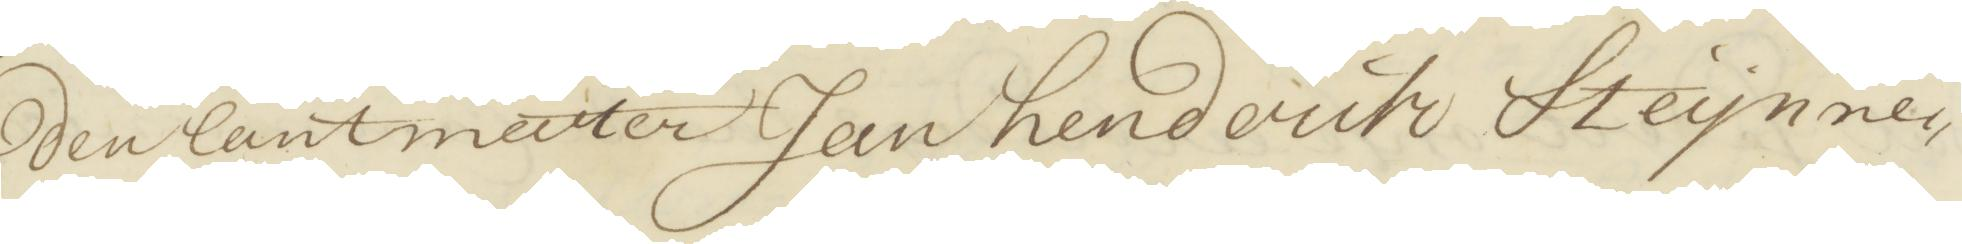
den lantmeeter Jan henderik Steijn ne„
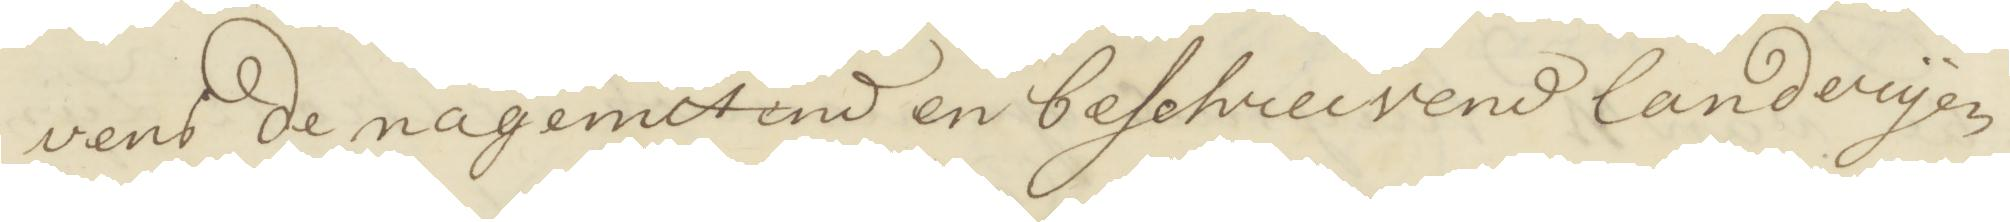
vens de nagemetene en beschreevene landerijen
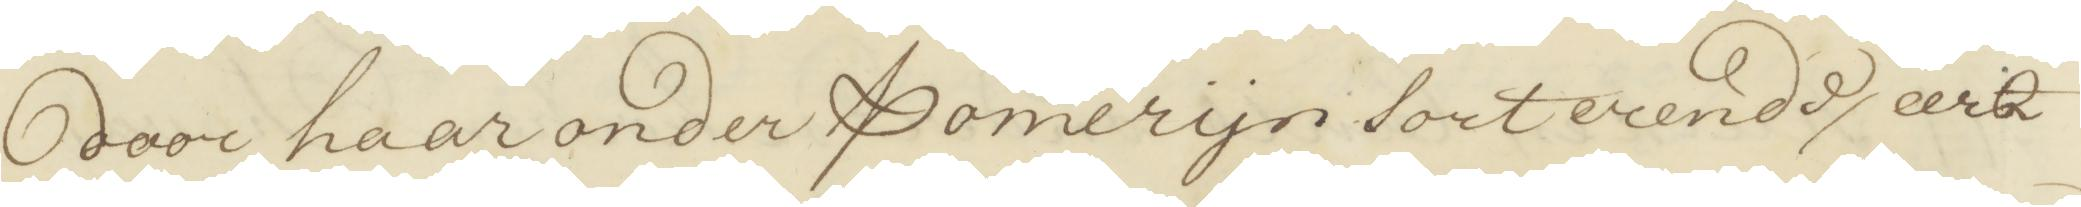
door haar onder Pomerijn sorterende, eerst
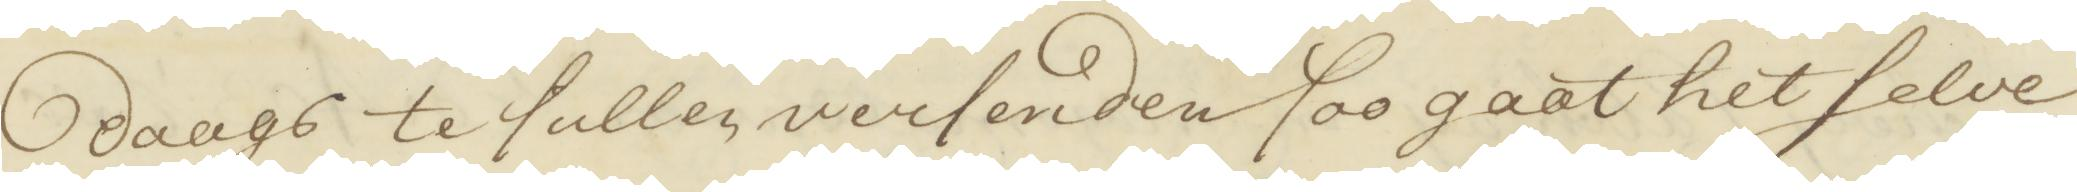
daags te sullen versenden soo gaat het selve
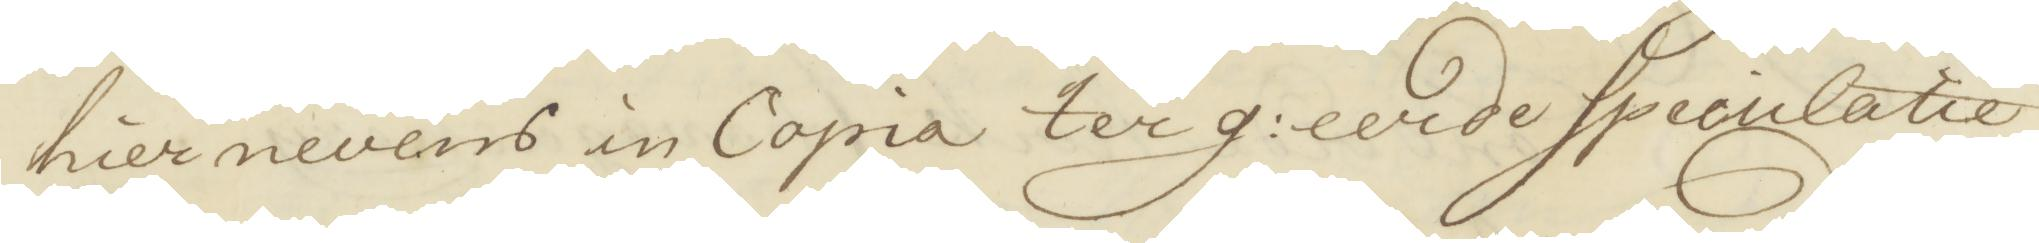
hier nevens in Copia ter g:eerde speculatie
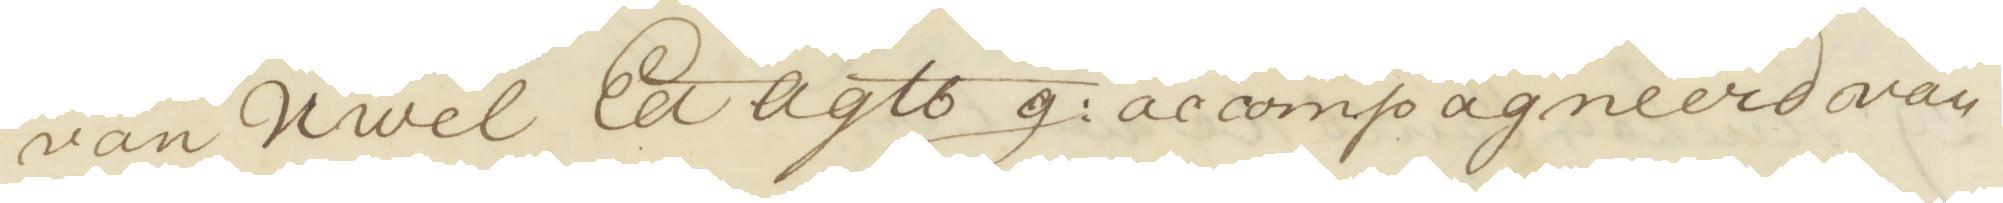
van Uwel Ed Agtb g:accompagneerd van
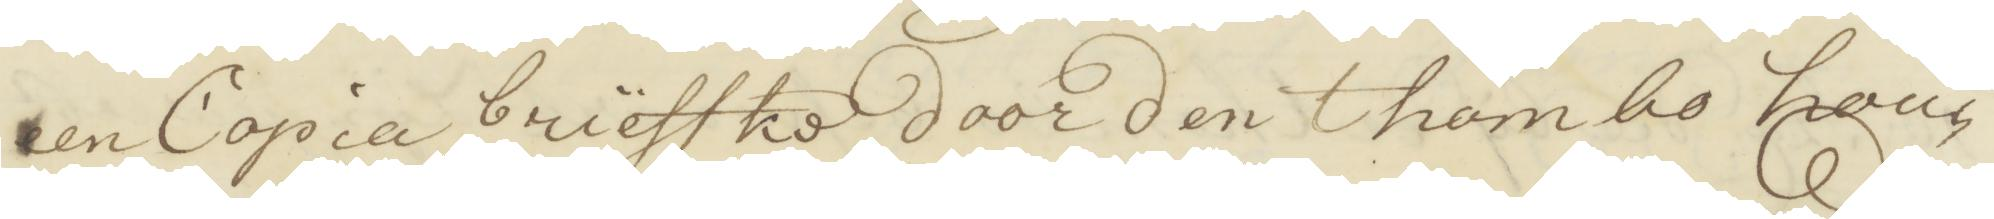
een Copia brieffke door den thombo hou„
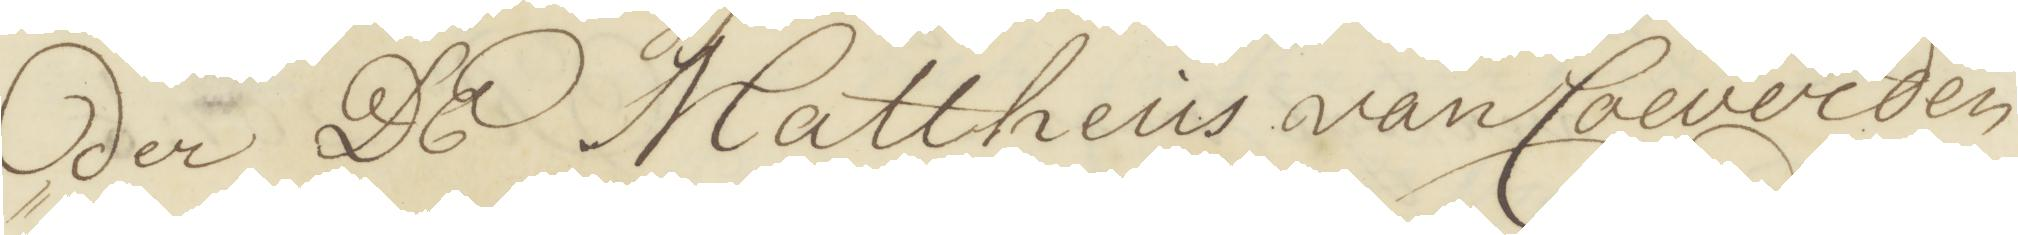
der DE Mattheus van Coeverden
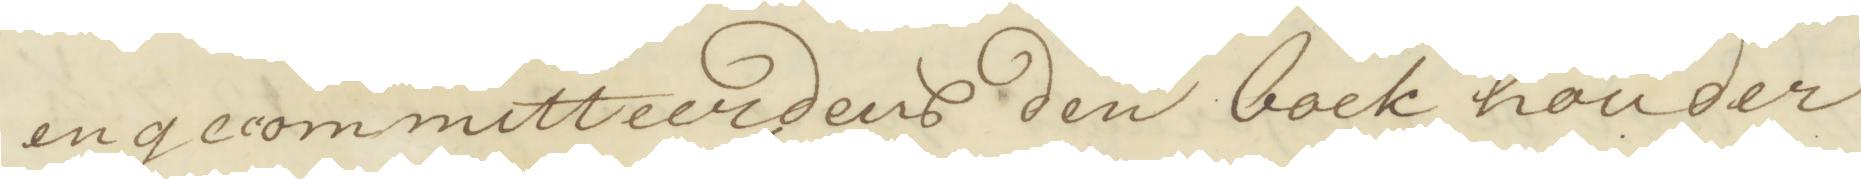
en gecommitteerdens den boek houder
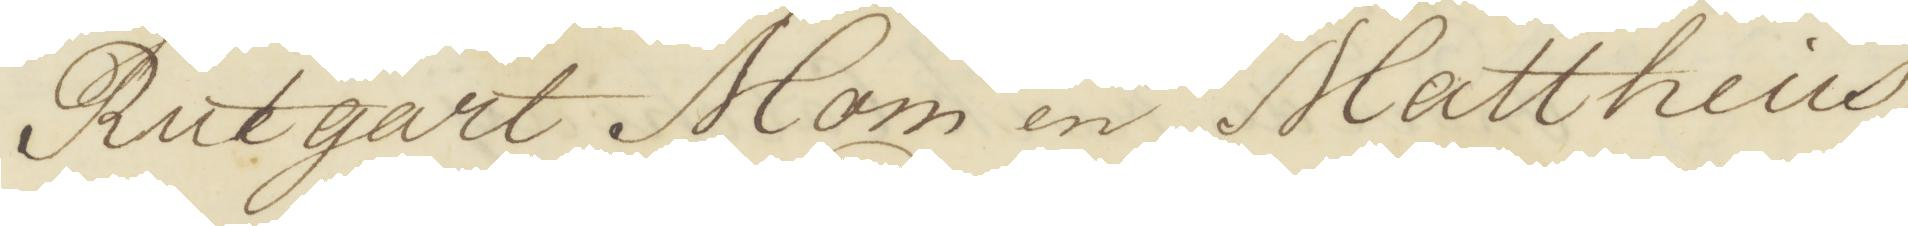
Rutgart Mom en Mattheus
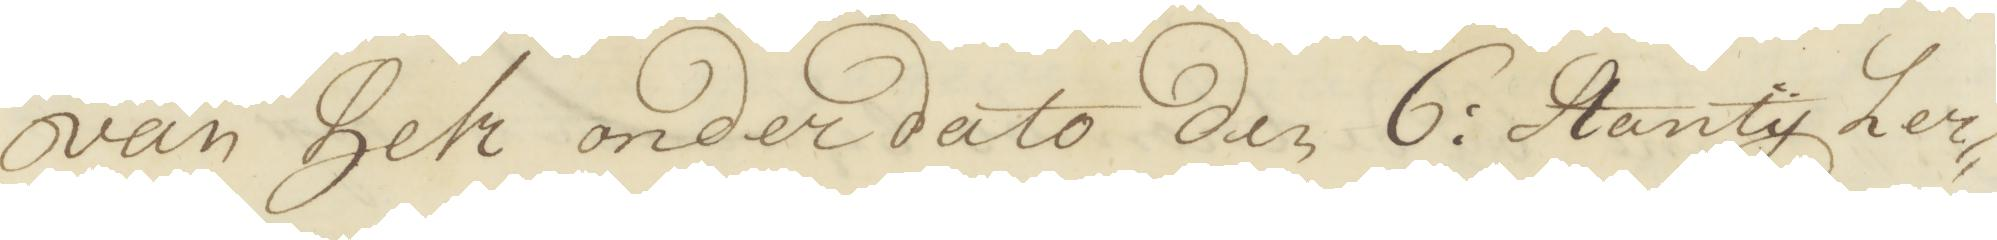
van Hek onder dato den 6: Stantij her„
